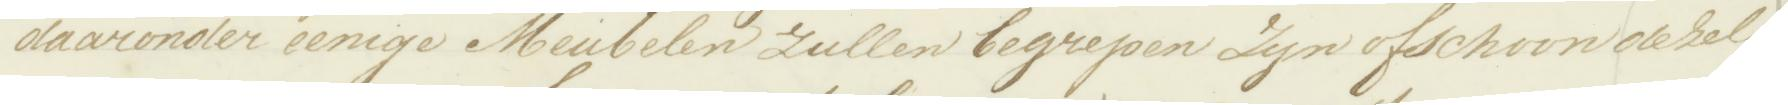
daaronder eenige Meubelen zullen begrepen zyn ofschoon dezel
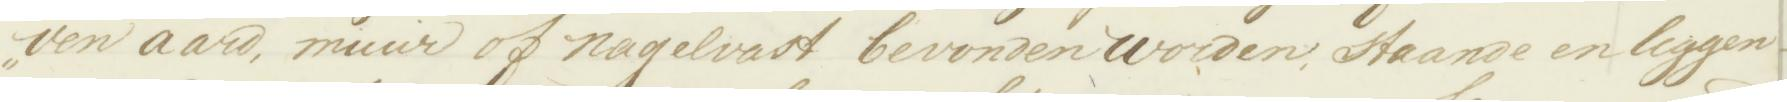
„ven aard, muur of nagelvast bevonden worden, staande en liggen
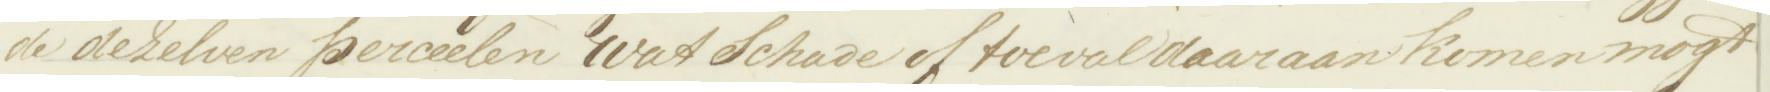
de dezelven perceelen wat schade of toeval daaraan komen mogt
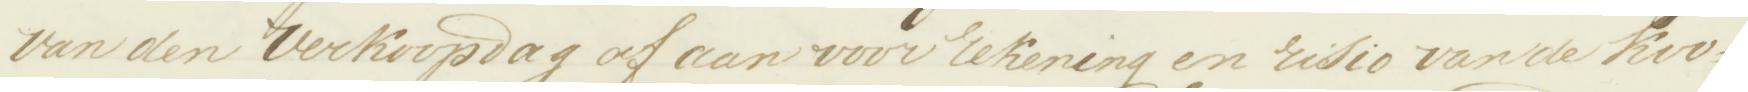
van den verkoopdag af aan voor rekening en risio van de Koo=
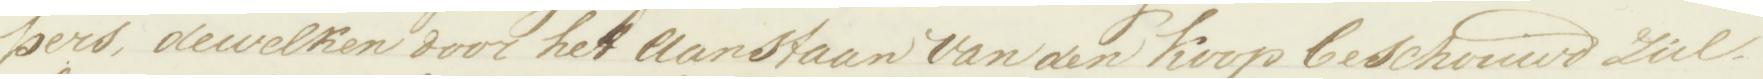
pers, dewelken door het Aanstaan van den koop beschouwd zul„
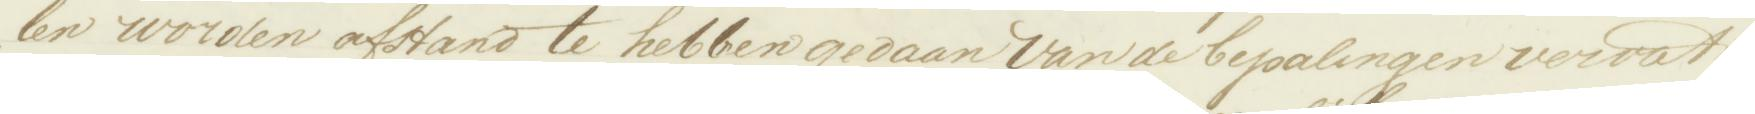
len worden afstand te hebben gedaan van de bepalingen vervat
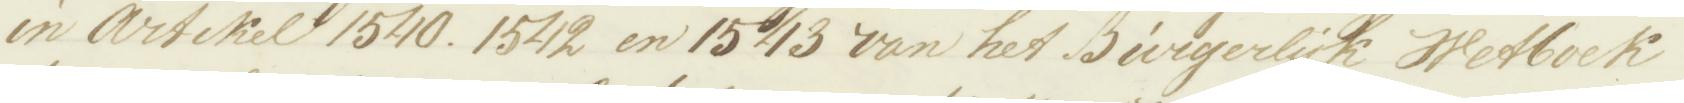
in Artikel 1540. 1542 en 1543 van het Burgerlijk Wetboek
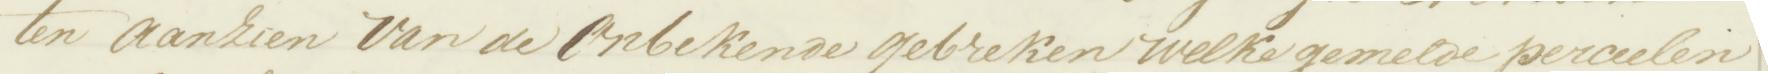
ten aanzien van de Onbekende gebreken welke gemelde perceelen
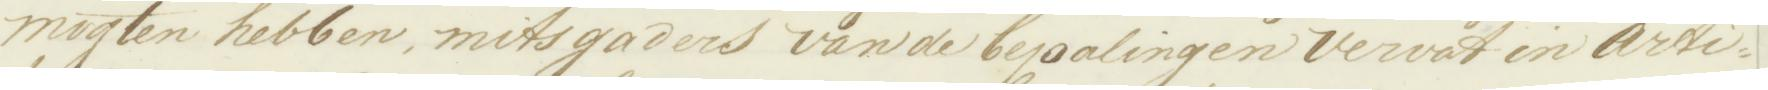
mogten hebben, mitsgaders van de bepalingen vervat in arti„
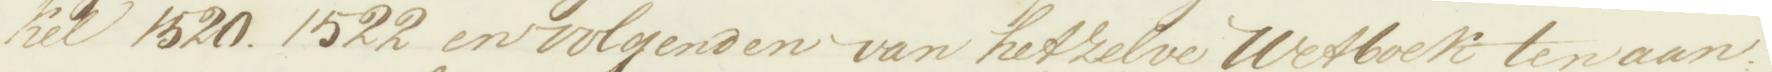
kol 1520. 1522 en volgenden van hetzelve Wetboek ten aan:
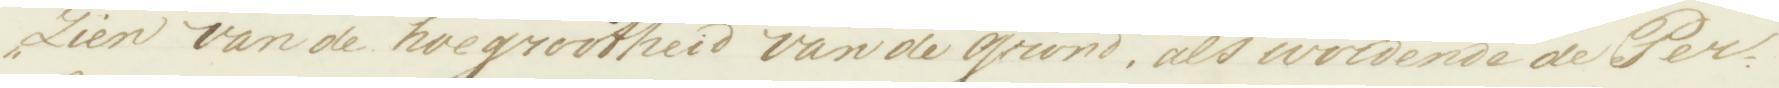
„zien van de hoegrootheid van de grond, als wordende de Per„
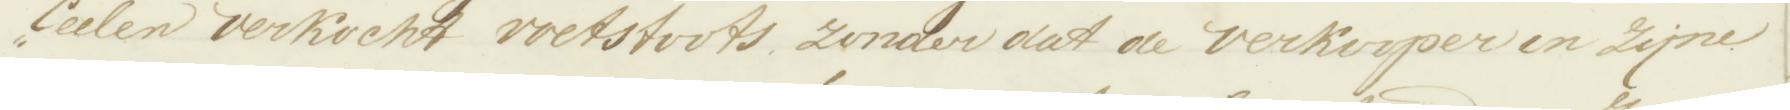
„ceelen verkocht voetstoots, zonder dat de verkooper in zijne
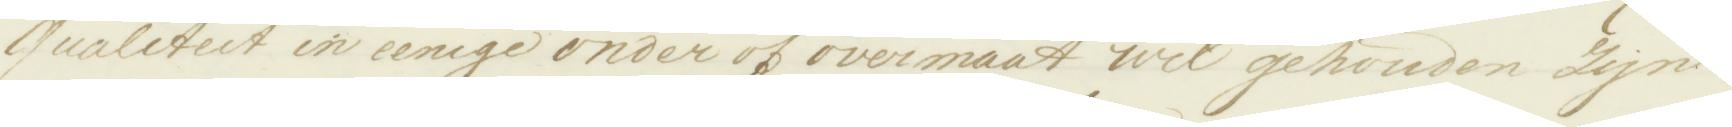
qualiteit in eenige onder of overmaat wel gehouden zijn
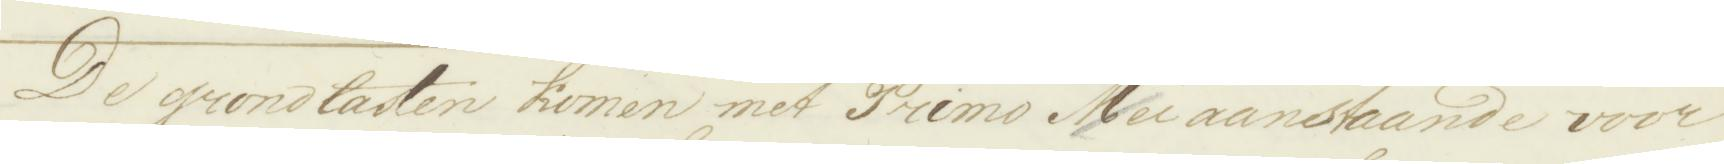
De grondlasten komen met Primo Mei aanstaande voor
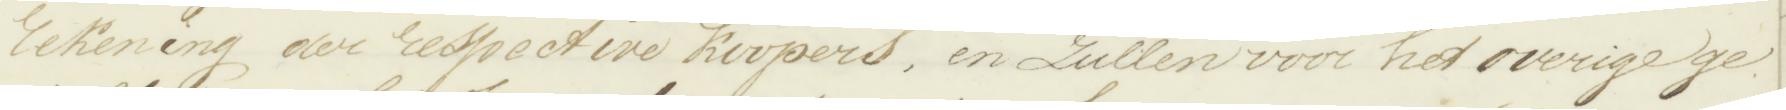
rekening der respective koopers, en zullen voor het overige ge„
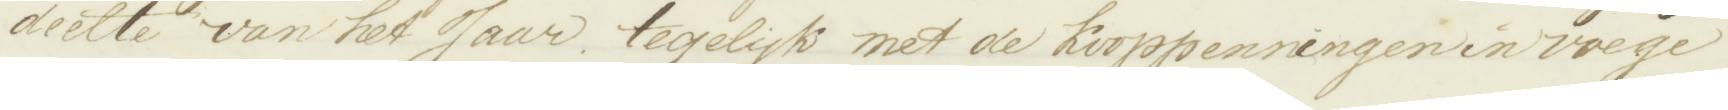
deelte van het Jaar tegelijk met de kooppenningen in voege
